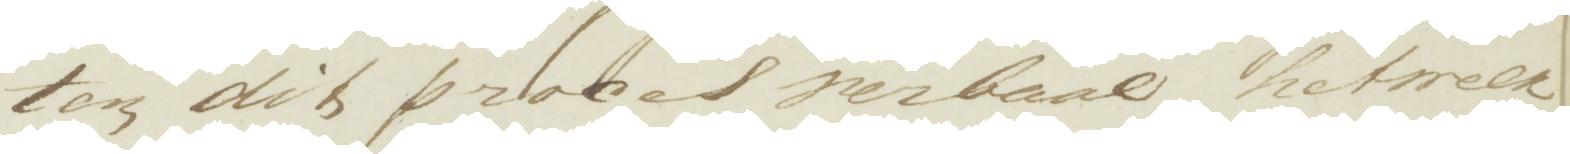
ten dit proces verbaal, hetwelk
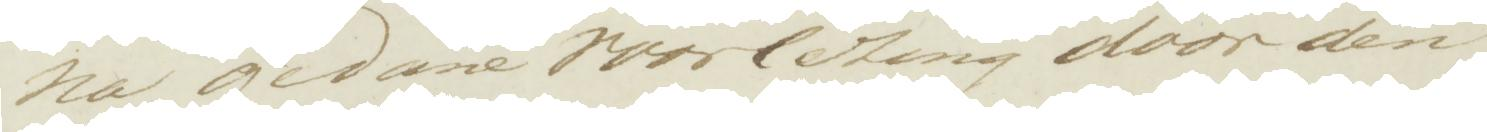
na gedane voorlezing door den
